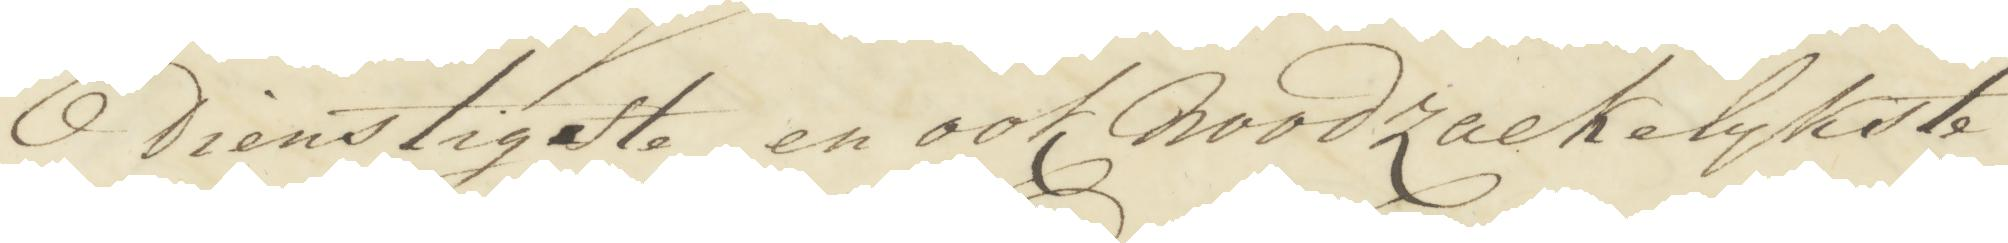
dienstigste, en ook noodzaekelykste
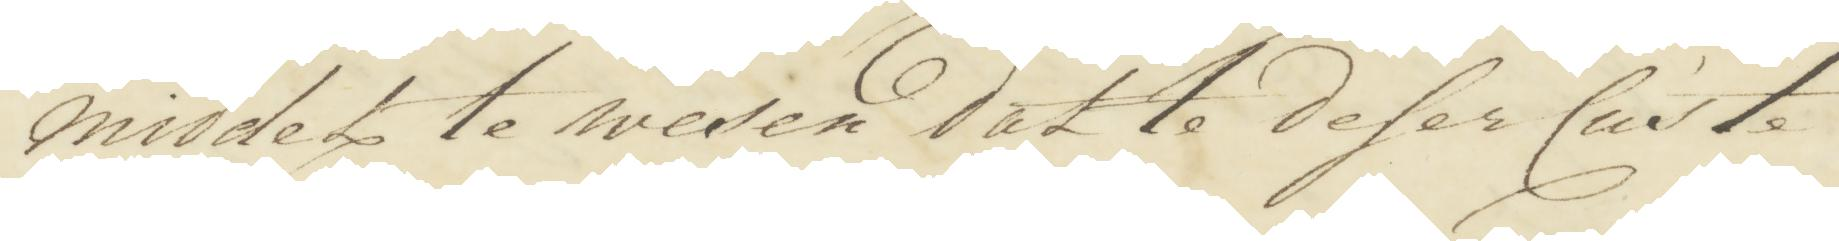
middel te wesen dat te deser Custe
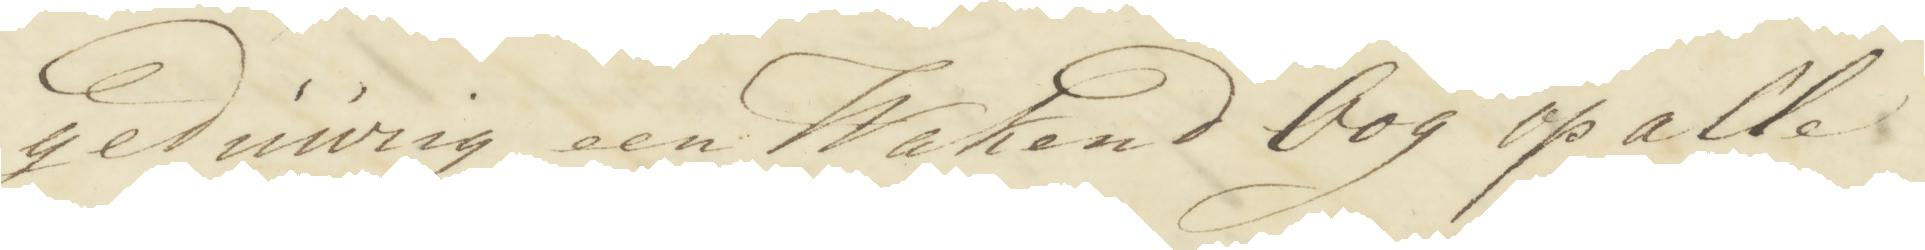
geduurig een Wakend Oog op alle
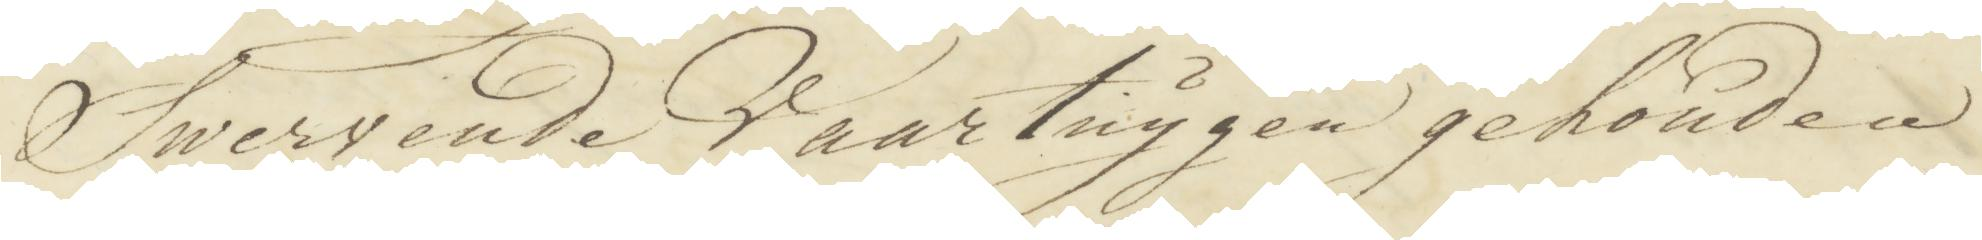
swervende vaartuijgen gehouden
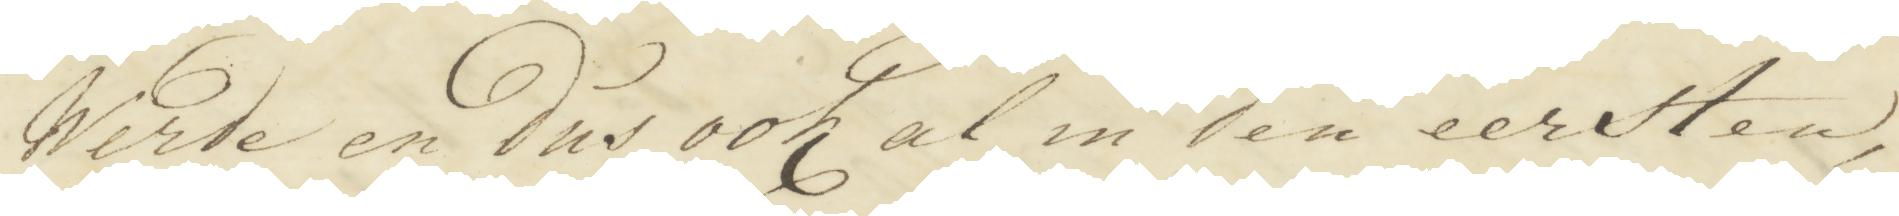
werde en dus ook al in den eersten,
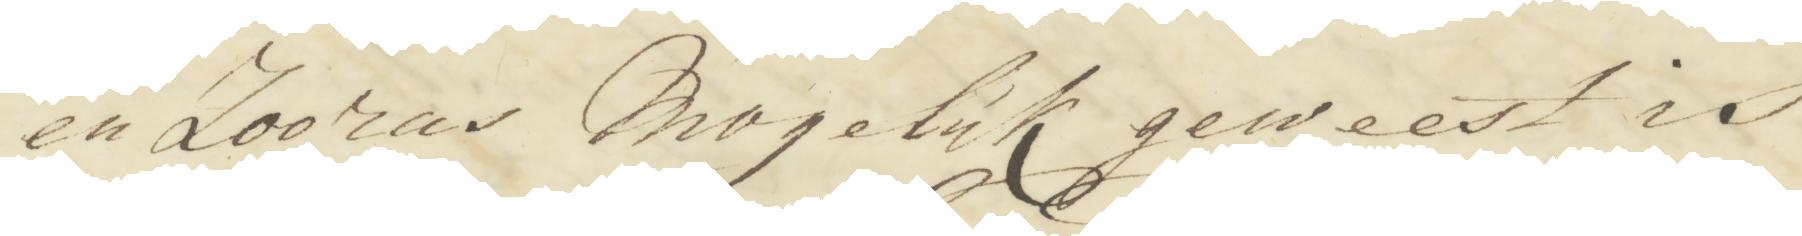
en Zoo ras mogeluk geweest is
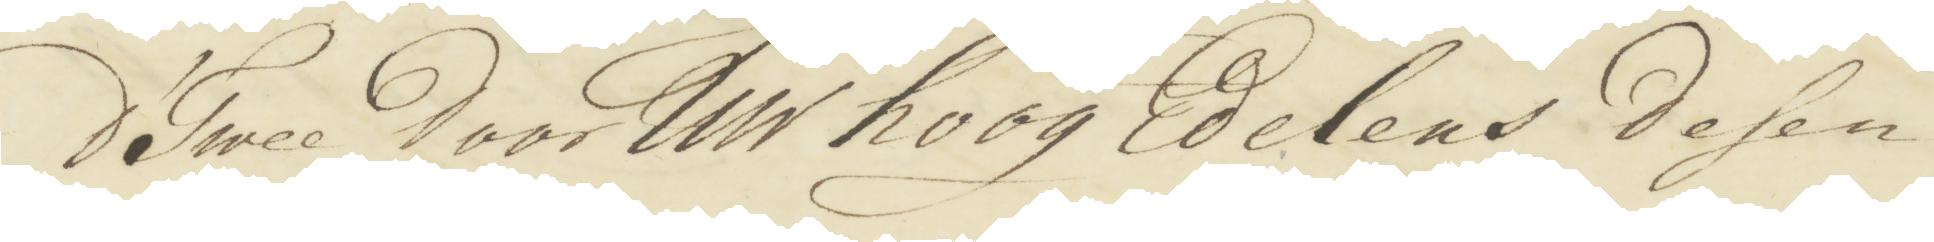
d' Twee door UW hoog Edelens desen
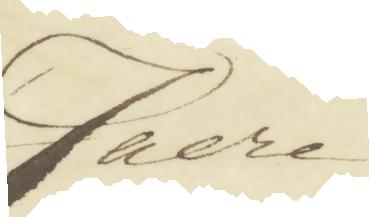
Jaere
